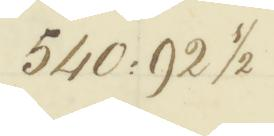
540:92½
